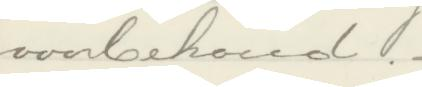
voorbehoud.
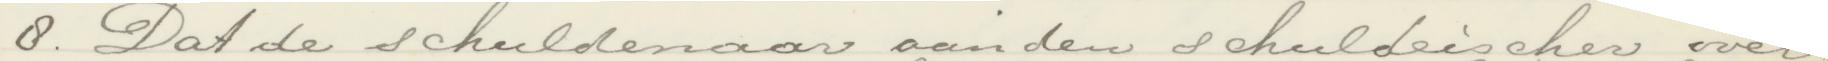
8. Dat de schuldenaar aan den schuldeischer over
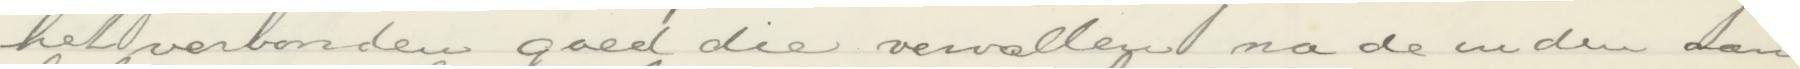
het verbonden goed die vervallen na de in den aan
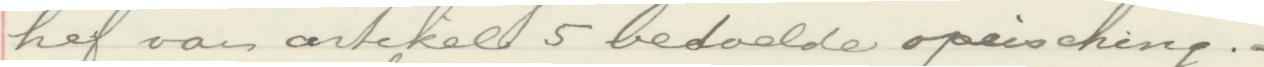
hef van artikel 5 bedoelde opeisching.
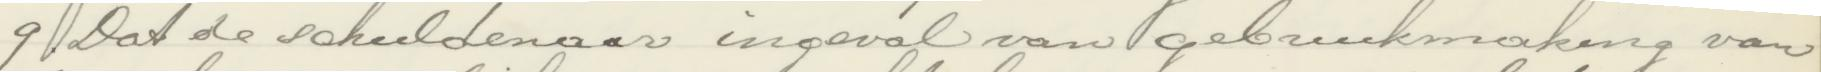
9. Dat de schuldenaar ingeval van gebruikmaking van
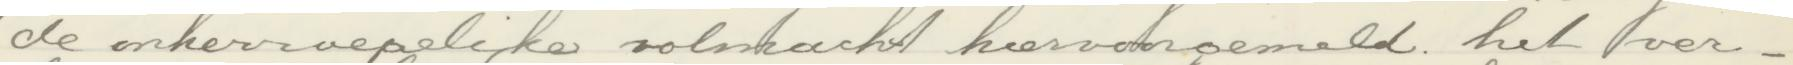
de onherroepelijke volmacht hiervoorgemeld het ver-
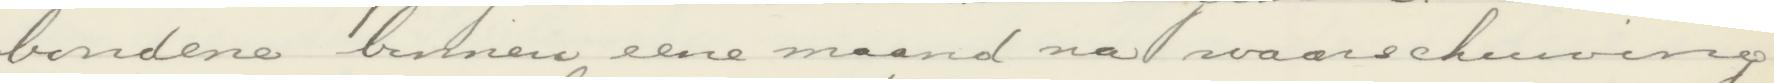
bindene binnen eene maand na waarschuwing
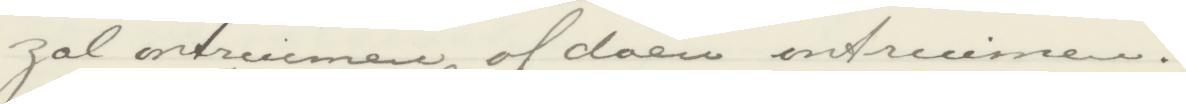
zal ontruimen of doen ontruimen.
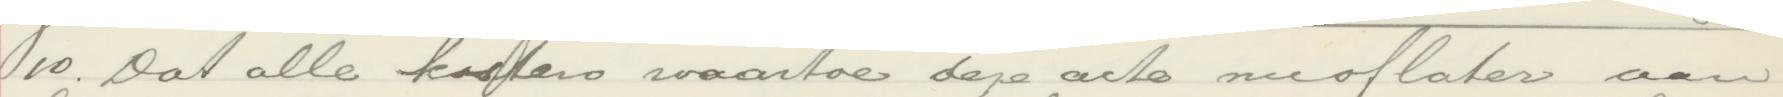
10. Dat alle kosten waartoe deze acte nu of later aan
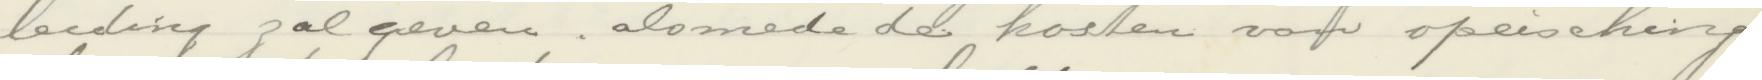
leiding zal geven, alsmede de kosten van opeisching
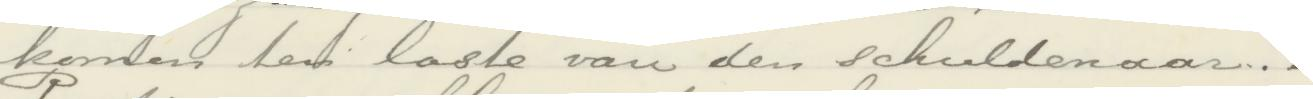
komen ten laste van den schuldenaar.
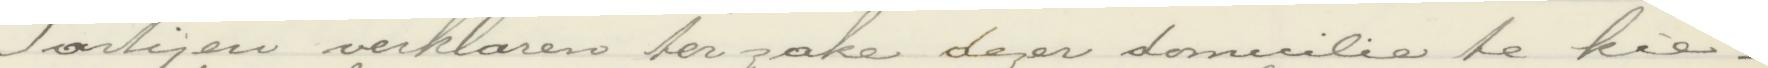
Partijen verklaren ter zake dezer domicilie te kien-
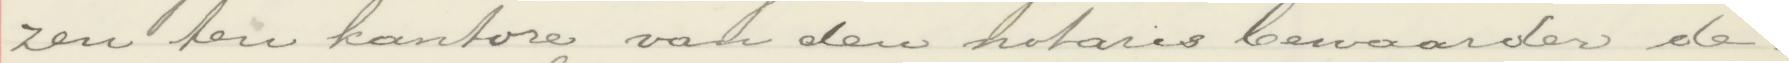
zen ten kantore van den notaris bewaarder de
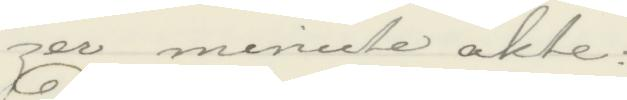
zer minute akte
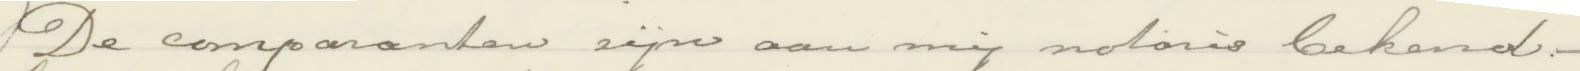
De comparanten zijn aan mij notaris bekend.
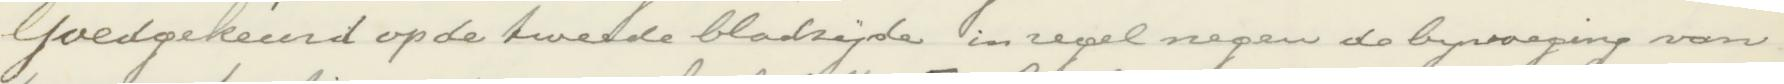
Goedgekeurd op de tweede bladzijde in regel negen de byvoeging van
